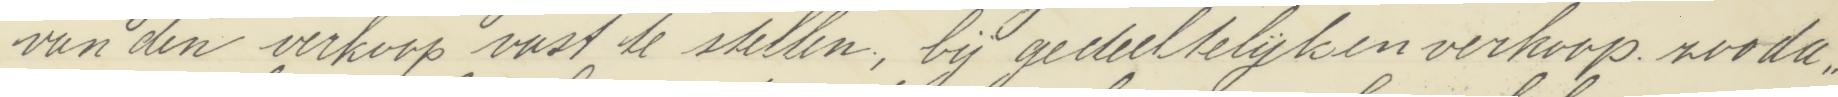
van den verkoop vast te stellen, bij gedeeltelijken verkoop. zooda„
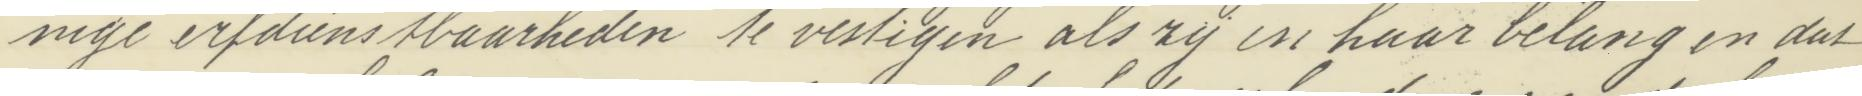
nige erfdienstbaarheden te vestigen als zij in haar belang en dat
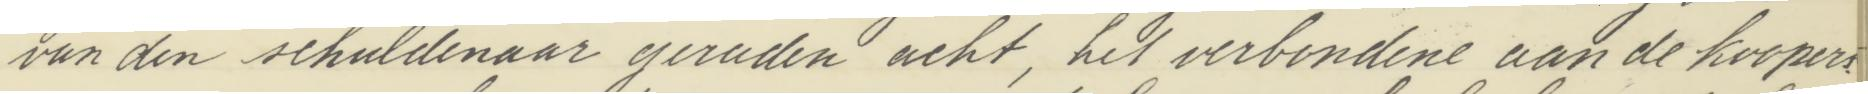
van den schuldenaar geraden acht, het verbondene aan de koopers
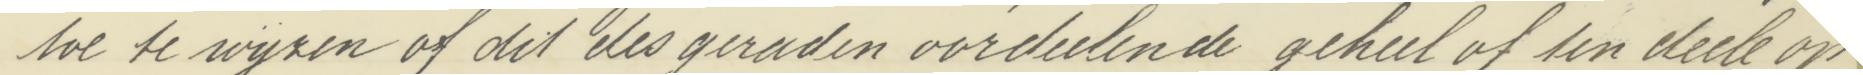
toe te wijzen of dit des geraden oordeelende geheel of ten deele op
